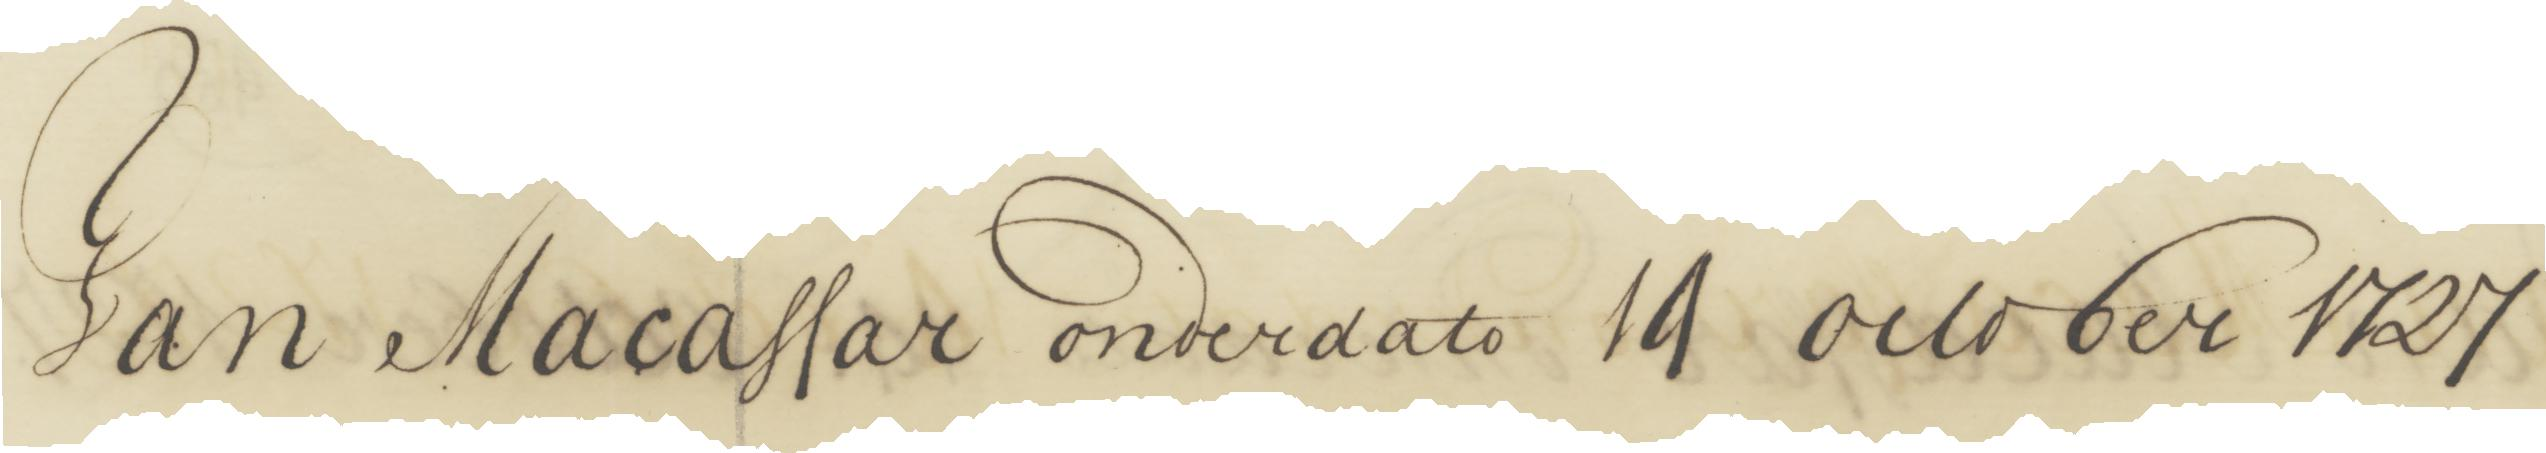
Van Macassar onder dato 14 october 1727
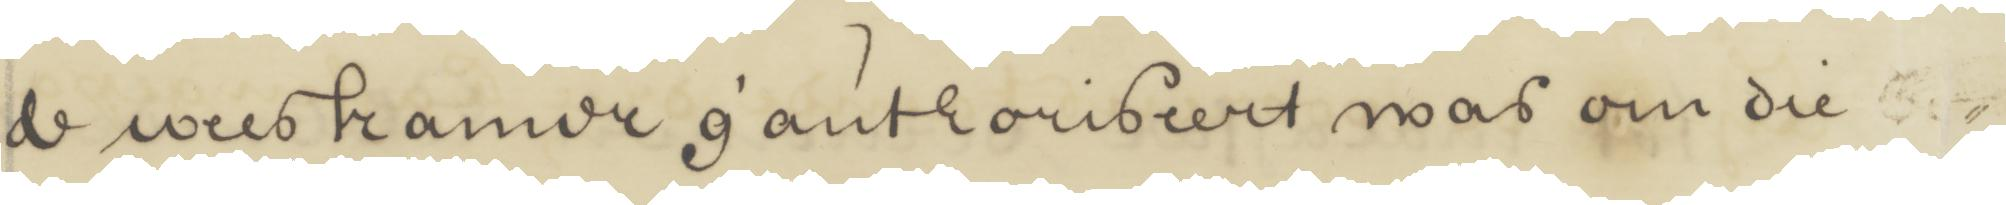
de weeskamer g’authoriseert was om die
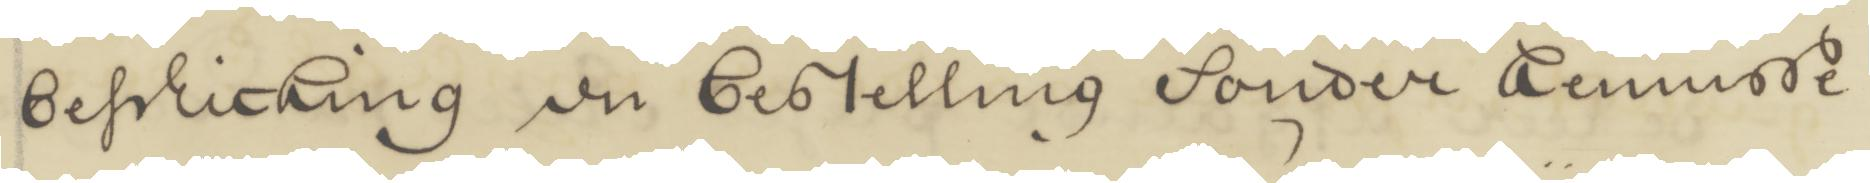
beschicking en bestelling sonder kennisse
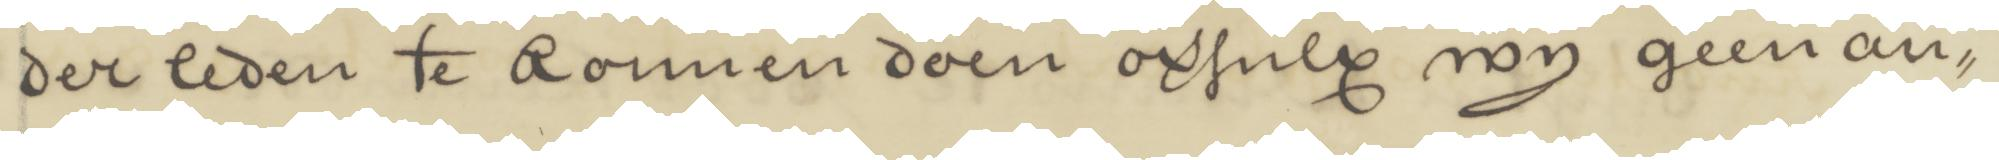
der leden te konnen doen oversulx wij geen an„
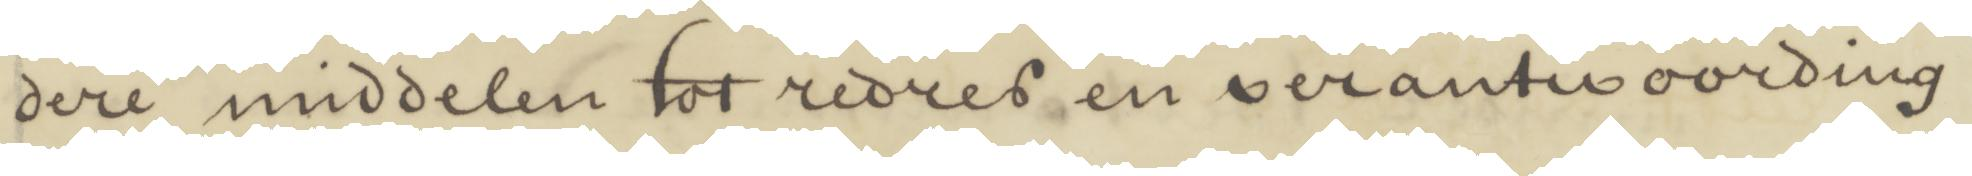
dere middelen tot redres en verantwoording
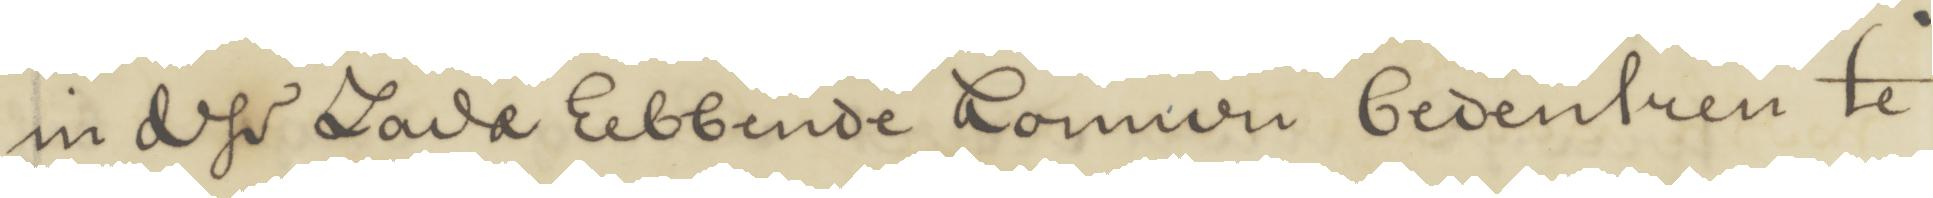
in dese zaek hebbende konnen bedenken te
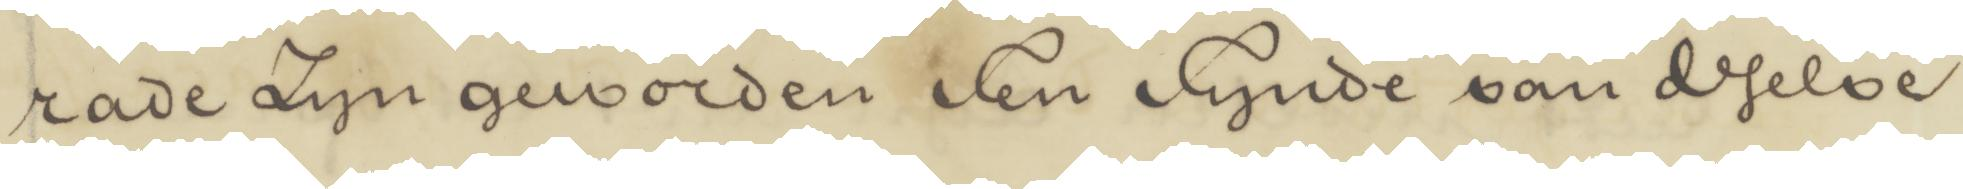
rade zyn geworden Een Eynde van deselve
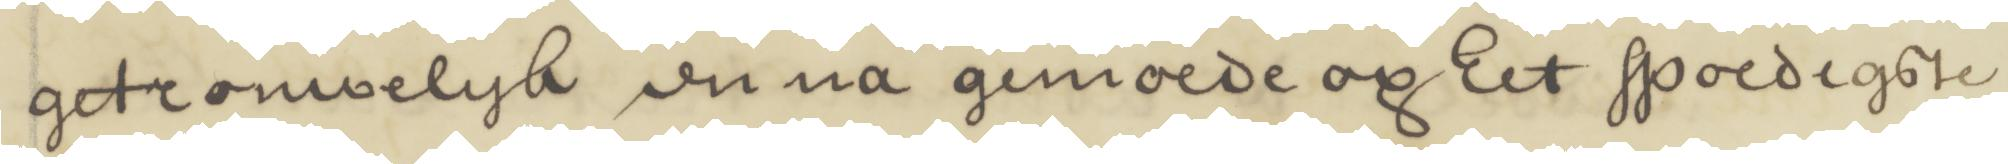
getrouwelyk en na gemoede op het spoedigste
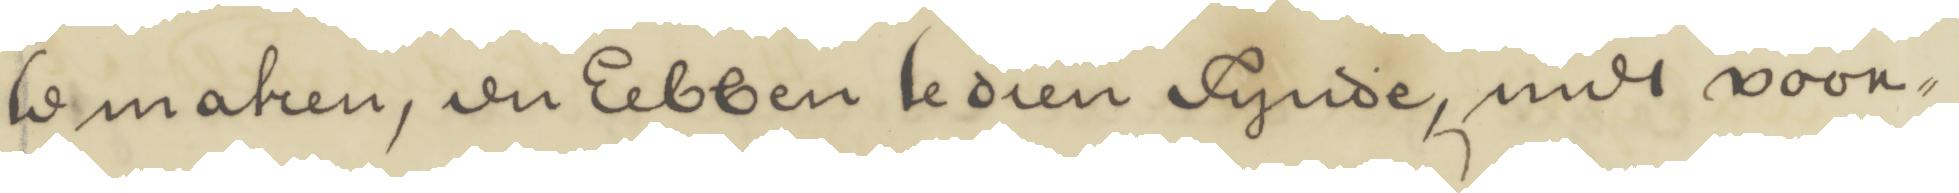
te maken, en hebben te dien Eynde, met voor„
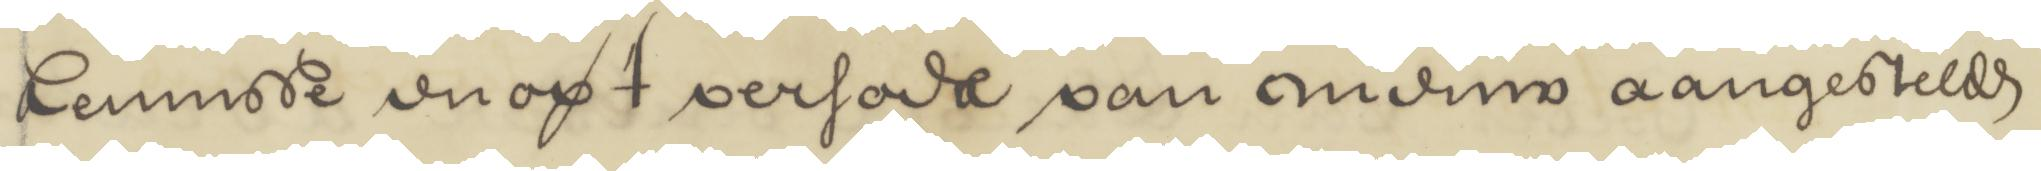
kennisse en op ’t versoek van nieuw aangestelden
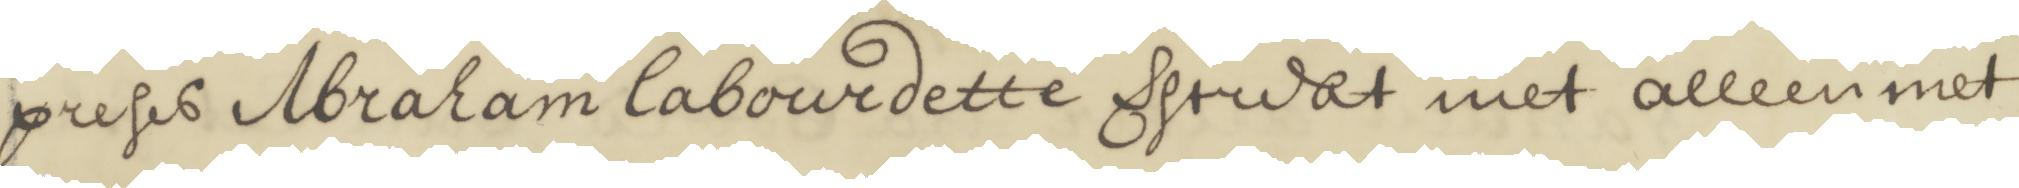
preses Abraham labourdette verstrekt niet alleen met
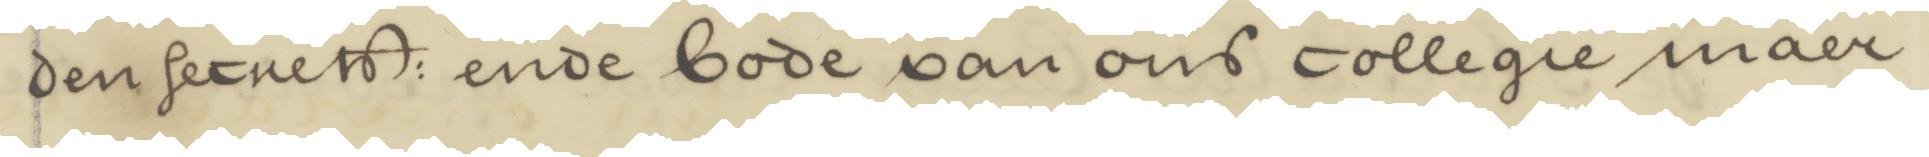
den secrets: ende bode van ons collegie maer
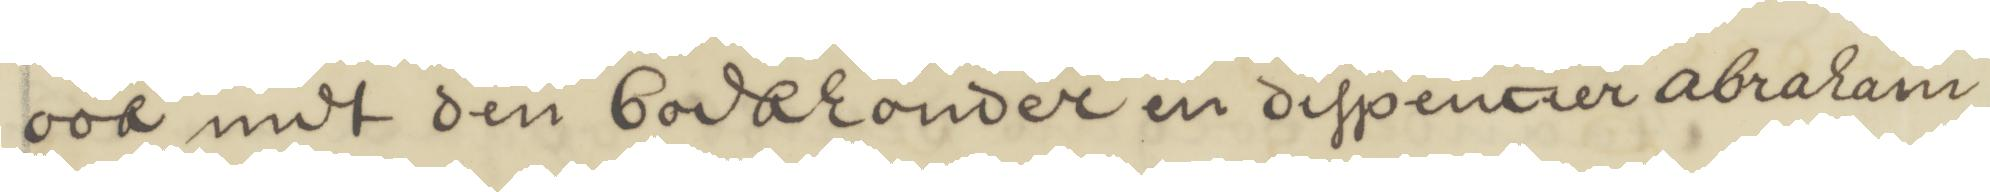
ook met den boekhouder en dispencier abraham
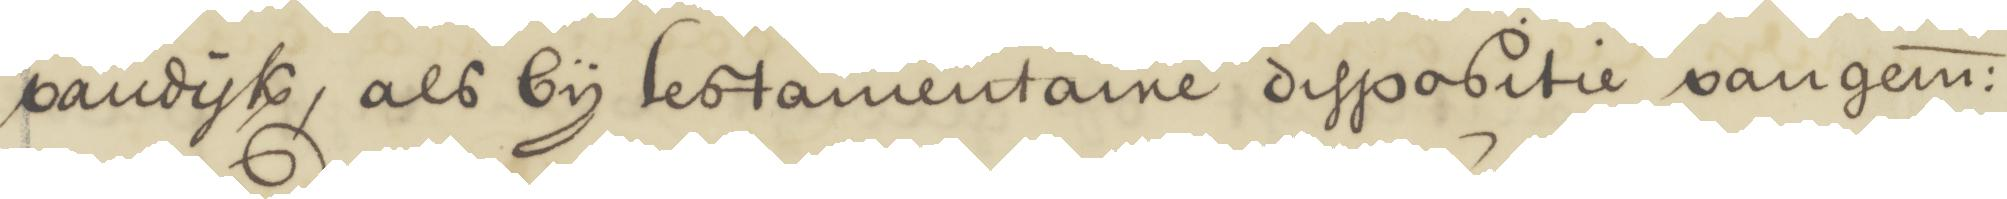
vandijk, als bij testamentaire dispositie van gem:
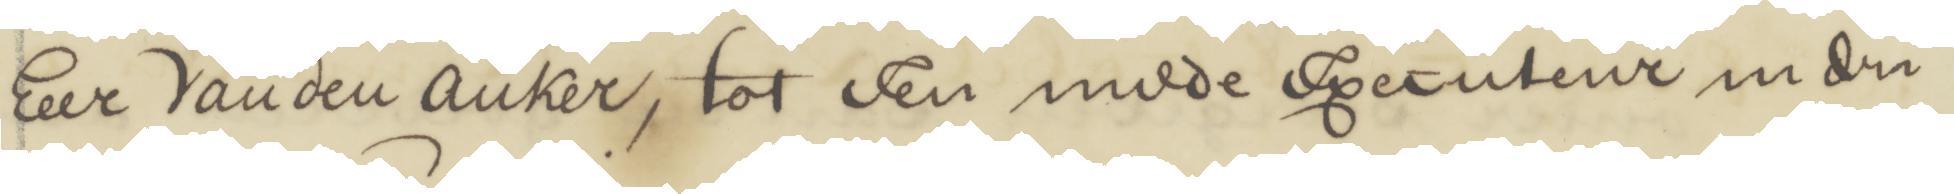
heer van den anker, tot Een mede Executeur in den
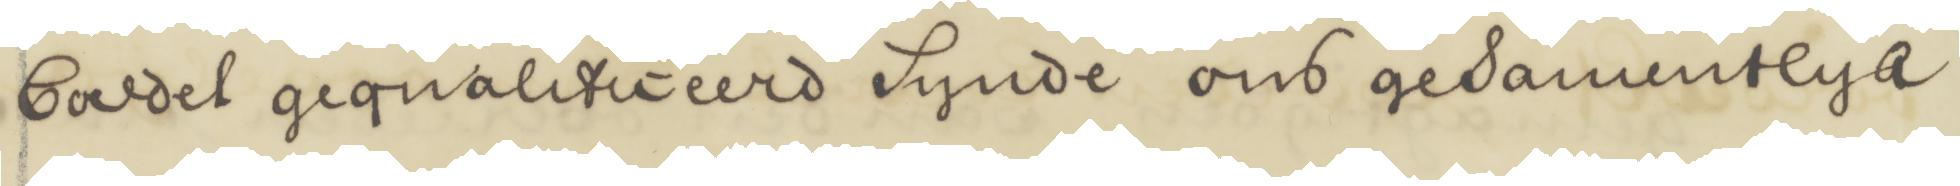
boedel gequalificeerd synde ons gesamentlyk
